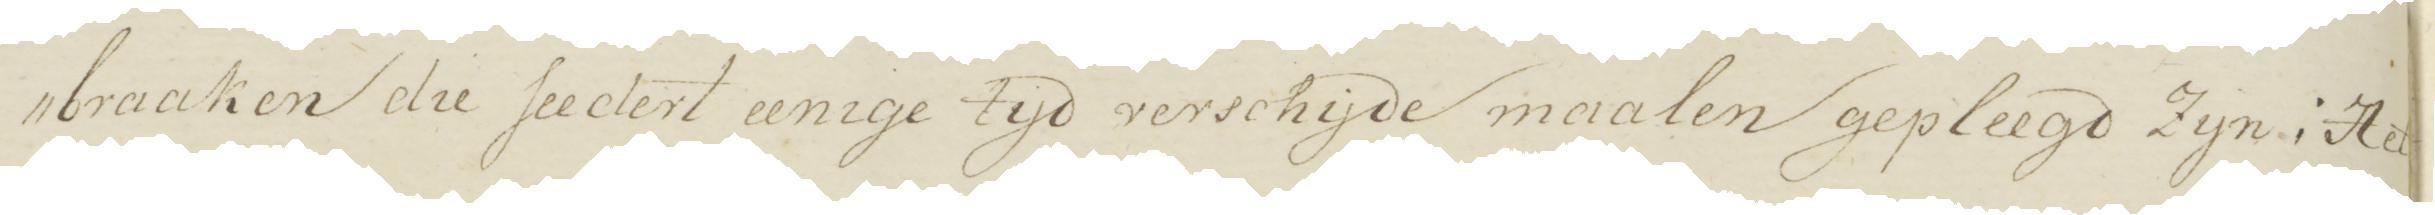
„braaken die seedert eenige tijd verschijde maalen gepleegd Zijn ; Het
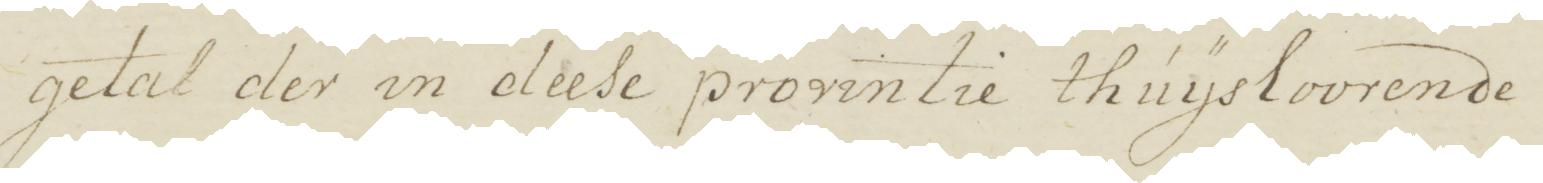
getal der in deese provintie thuijshoorende
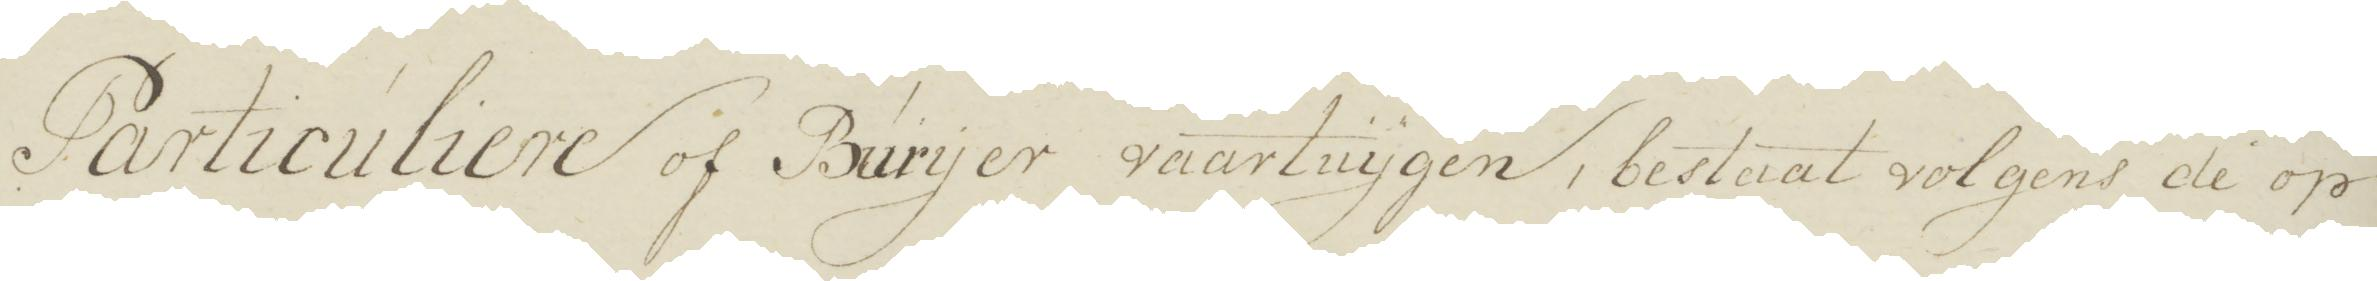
Particuliere of Burijer vaartuijgen, bestaat volgens de op
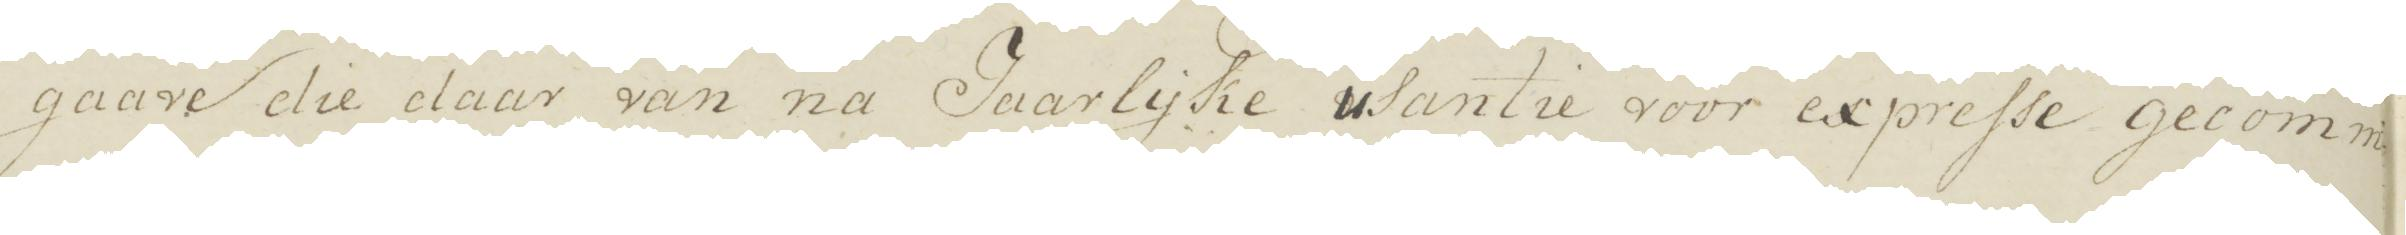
gaave die daar van na Iaarlijke usantie voor expresse gecommi
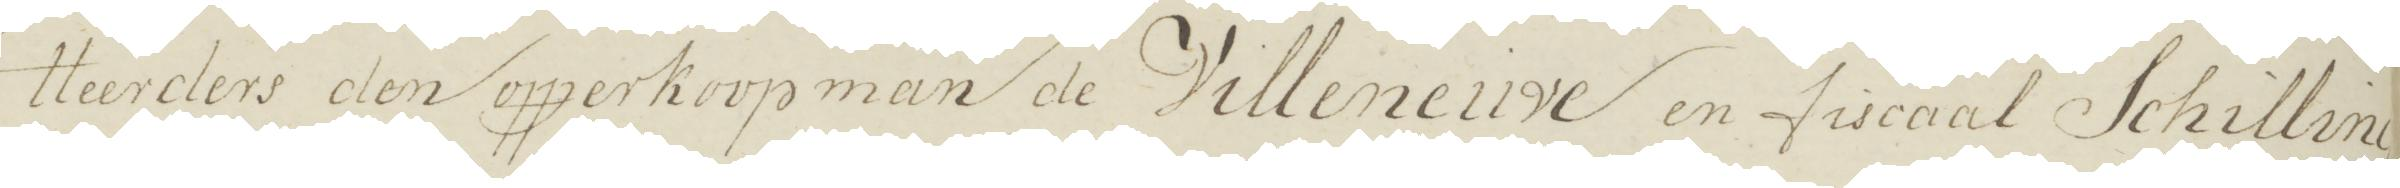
tteerders den opperkoopman de Villeneuve en fiscaal Schilling
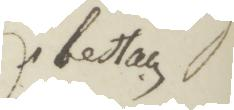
^bestaan
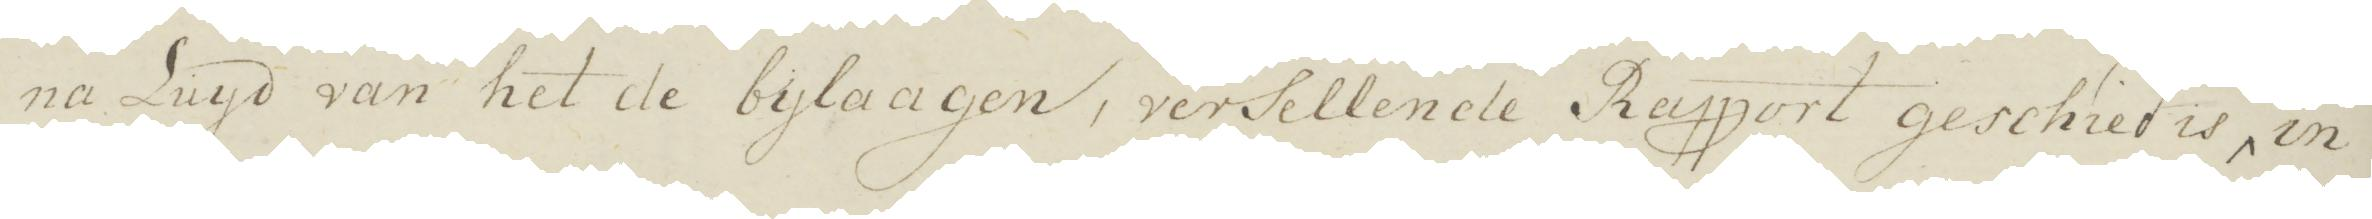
na Luyd van het de bijlaagen, versellende Rapport geschied is ^ in
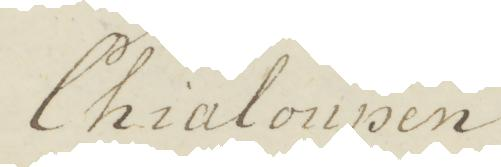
Chialoupen
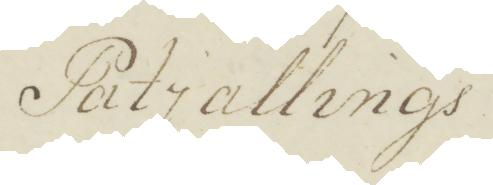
Patjallings
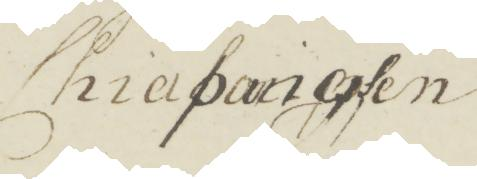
Chiapangsen
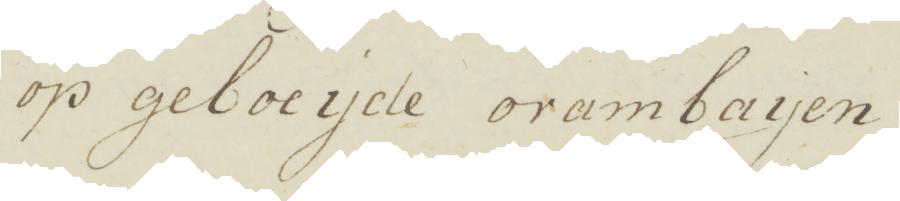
op geboeijde orambaijen
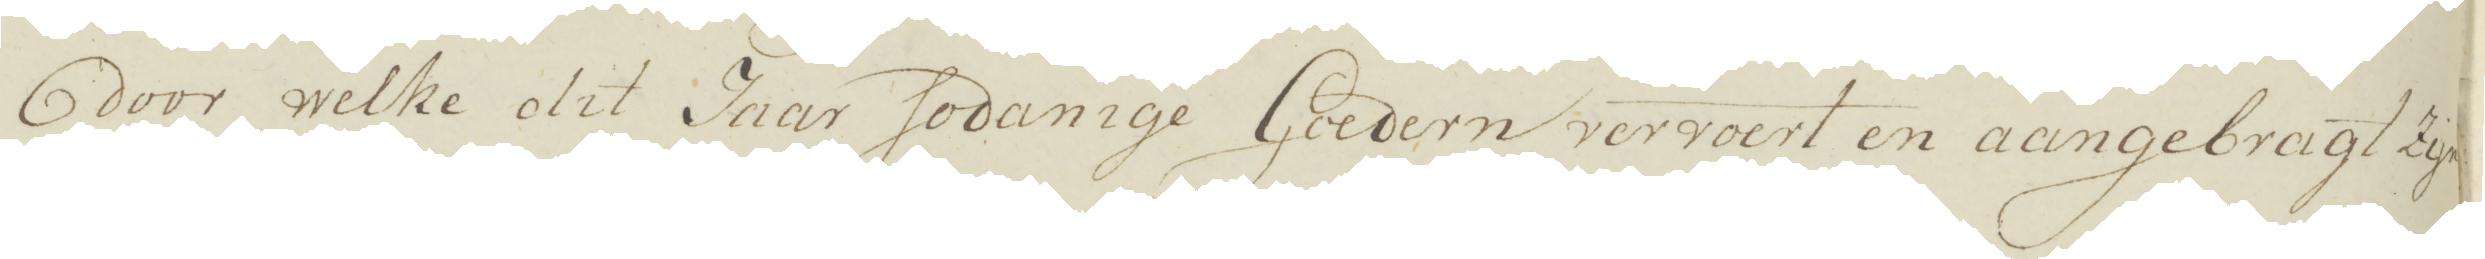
door welke dit Iaar Sodanige Goedern vervoert en aangebragt Zijn
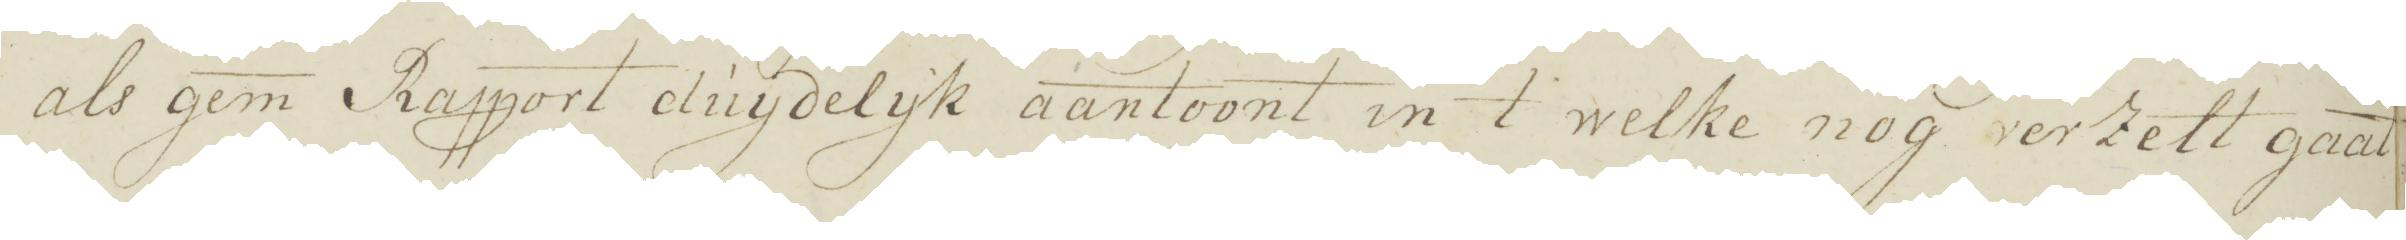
als gem Rapport duijdelijk aantoont in t' welke nog verzelt gaat
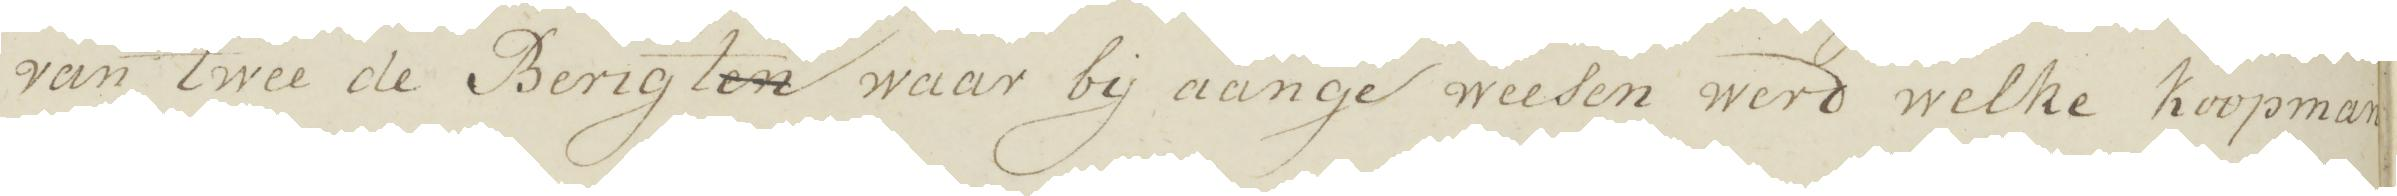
van twee de Berigten waar bij aange weesen werd welke koopman
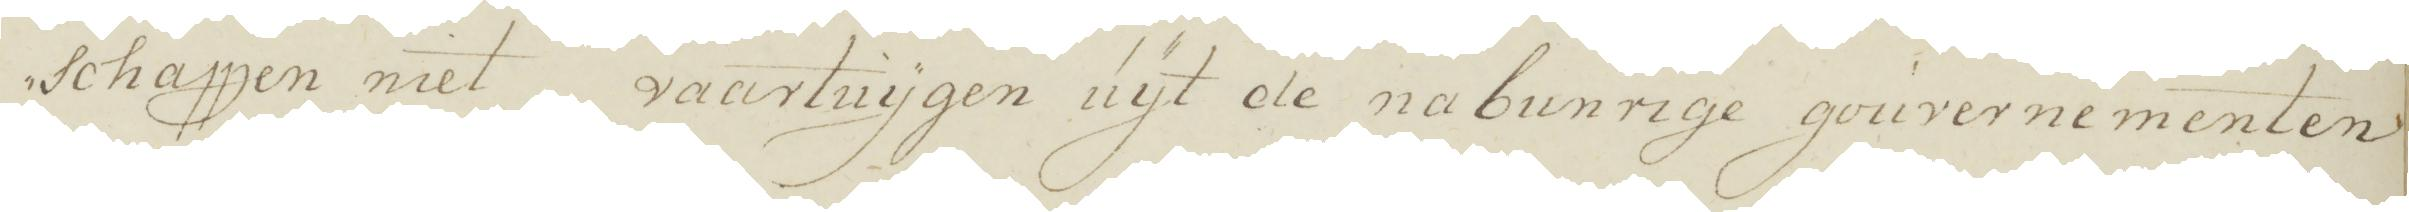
„schappen niet vaartuijgen uijt de nabunrige gouvernementen
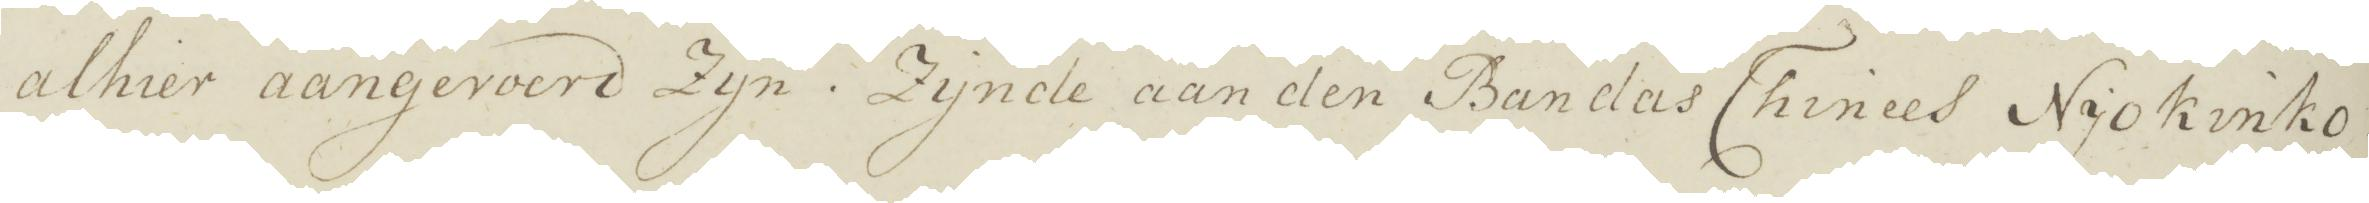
alhier aangevoerd Zijn. Zijnde aan den Bandas Chinees Njo kinko
